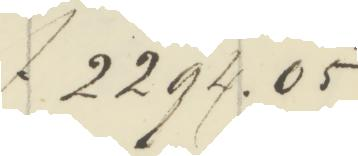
ƒ 2294.05=5
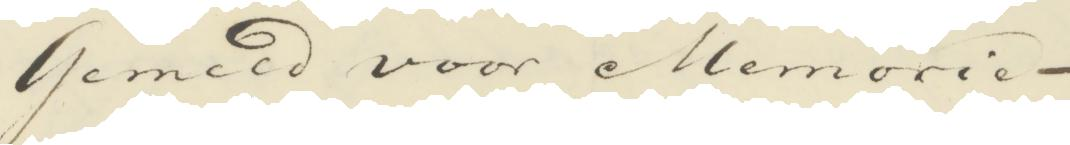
Gemeld voor Memorie
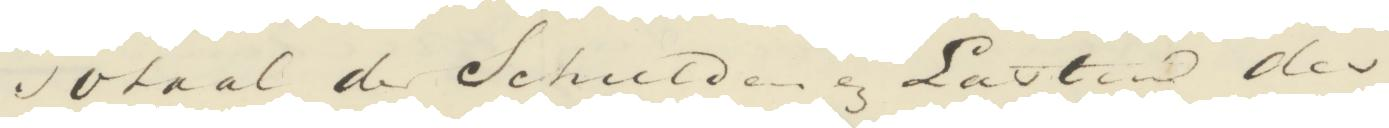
Totaal de Schulden en Lasten des
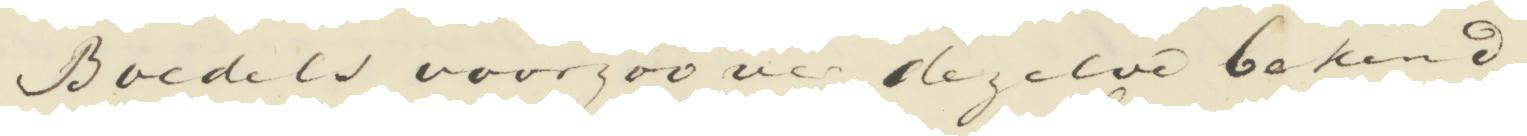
Boedels voorzoover dezelve bekend
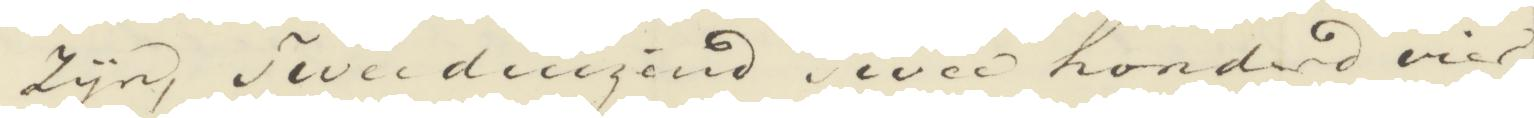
zijn, Twee duizend Twee honderd vier
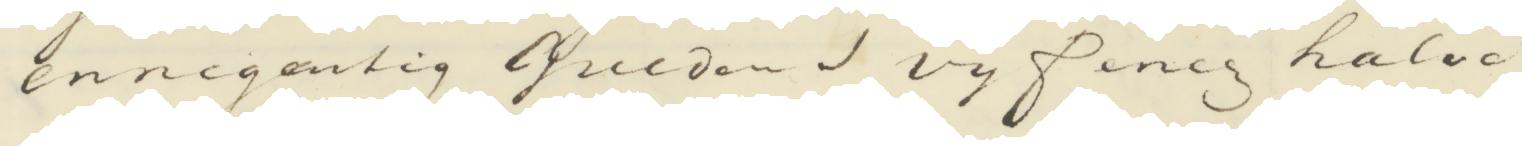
En negentig guldens vyf en en halve
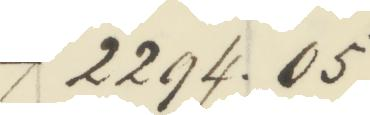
ƒ 2294.055
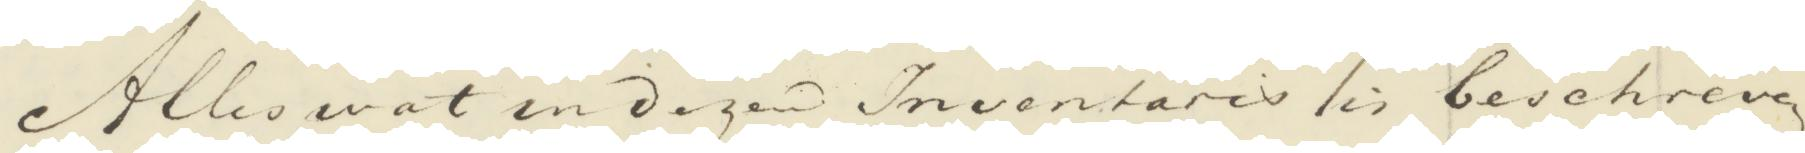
Alles wat in dezen Inventaris is beschreven
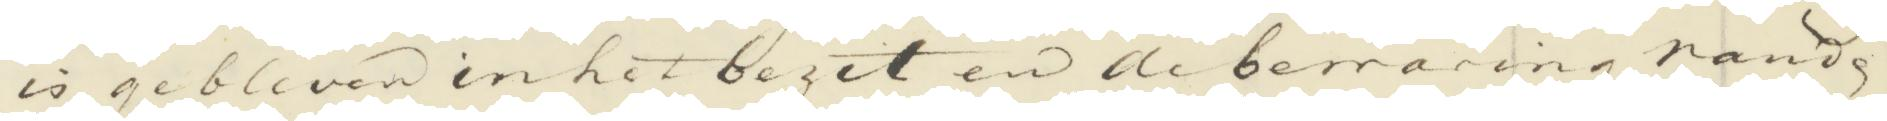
is gebleven in het bezit en de bewaring van den
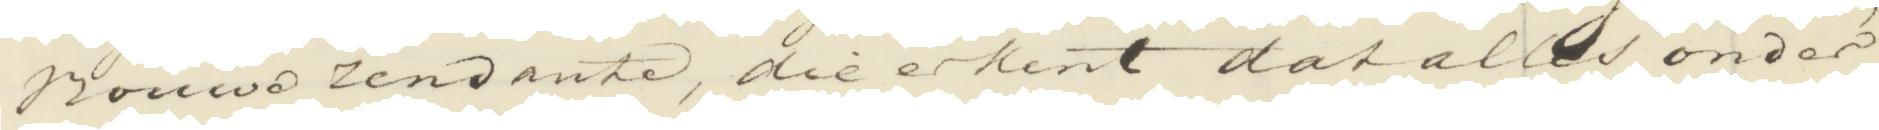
Vrouwe rendante, die erkent dat alles onder
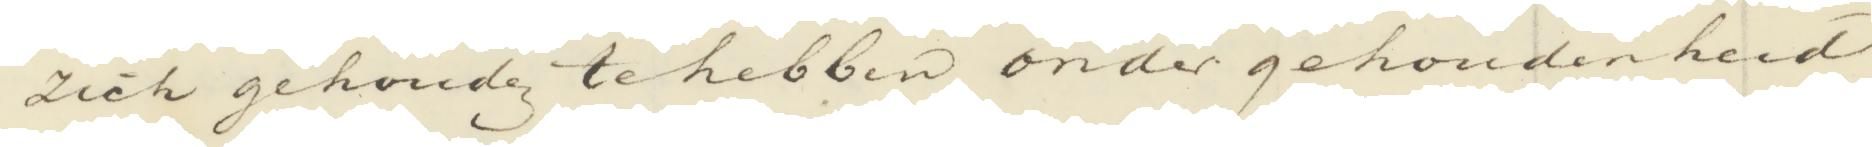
zich gehouden te hebben onder gehoudenheid
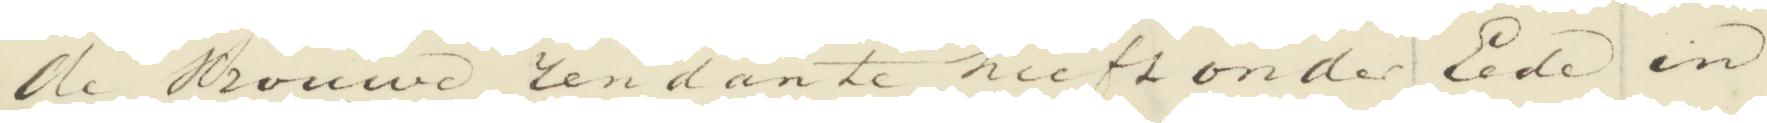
de Vrouwe rendante heeft onder Eede in
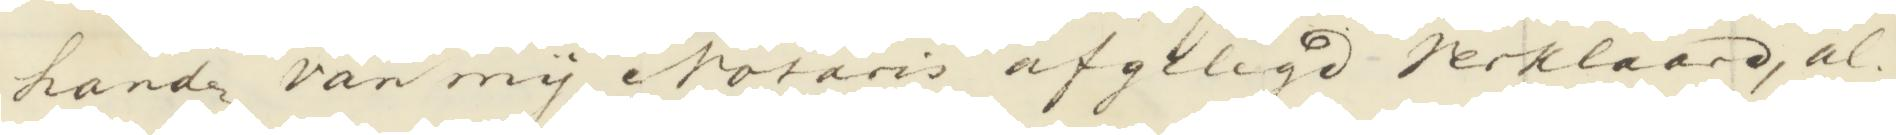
handen van mij Notaris afgelegd Verklaard, al.
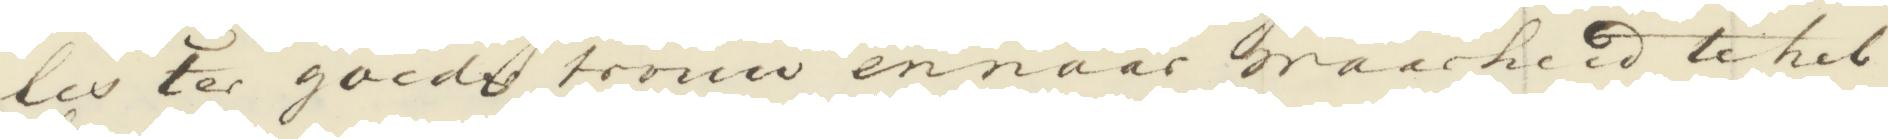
les ter goede trouw en naar waarheid te heb
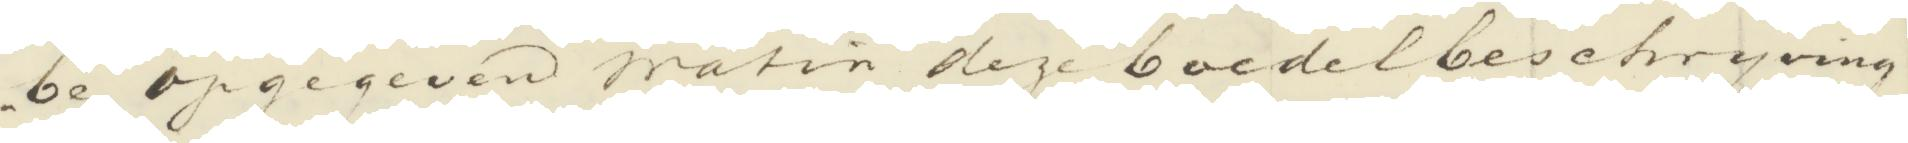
„be opgegeven wat in deze boedel beschryving
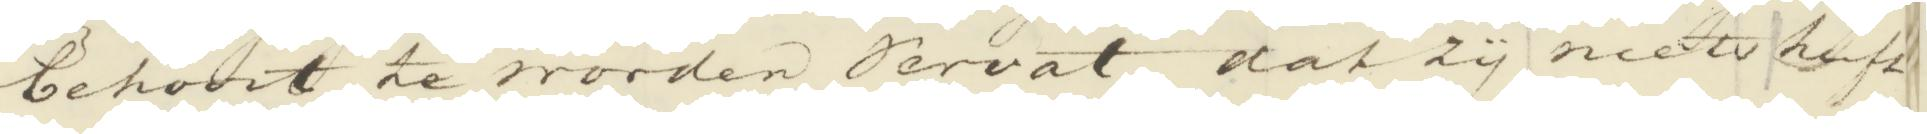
behoort te worden Vervat dat zij niets heeft
